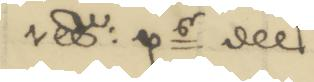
1 lb: p=r ell
